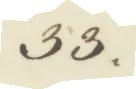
33.
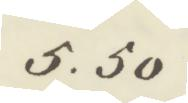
5. 50
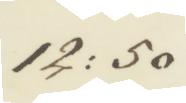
12:50
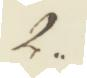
2..
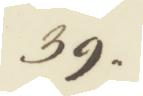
39„
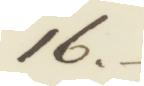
16.—
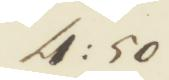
4:50
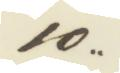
10..
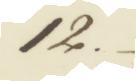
12.—
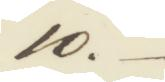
10. —
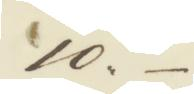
10„ —
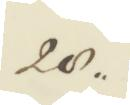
28„
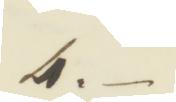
4. —
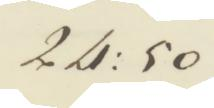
24: 50
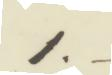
1.—
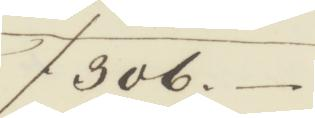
ƒ306.—
